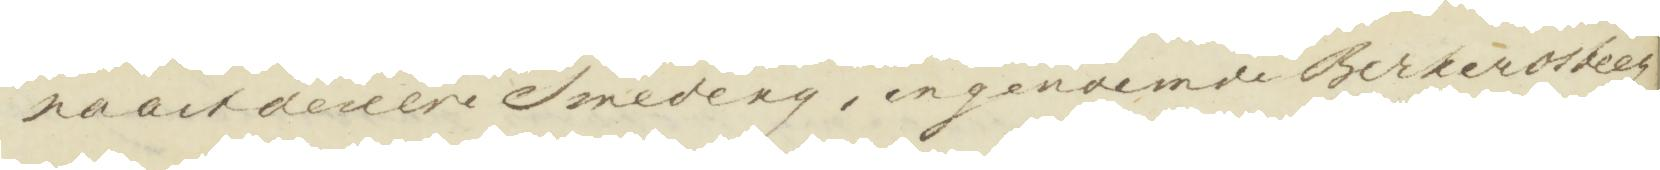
naast deselve Smedery, in genoemde Berkerosteeg
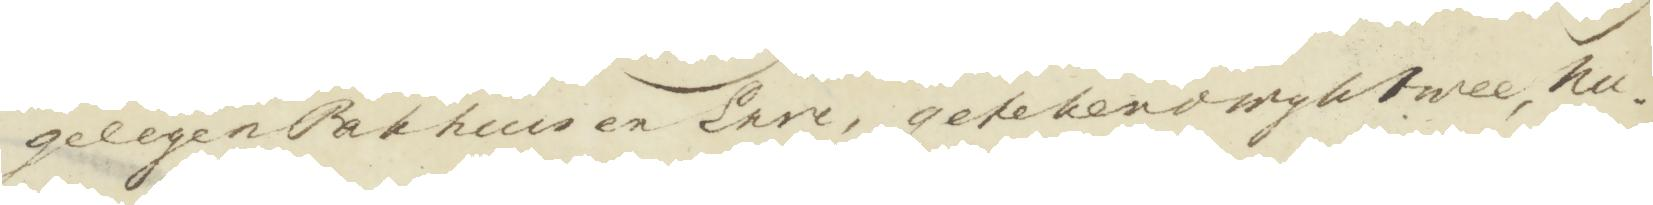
gelegen Pakhuis en Erve, getekend wyk twee, nu
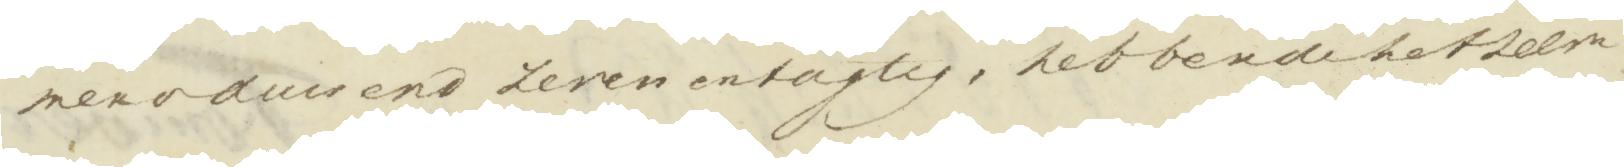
mero duisend zeven en tagtig, hebbende hetzelve
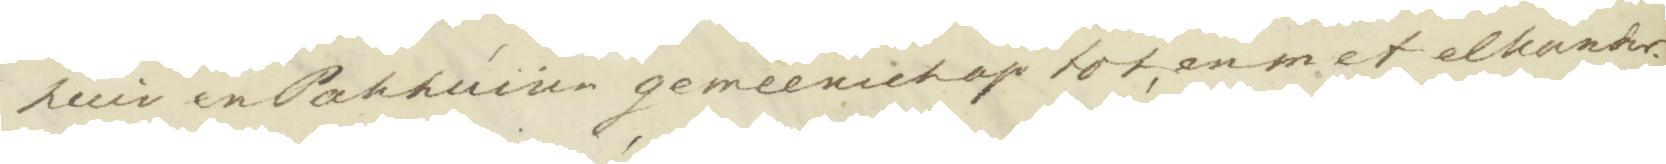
huis en Pakhuis en gemeenschap tot, en met elkande
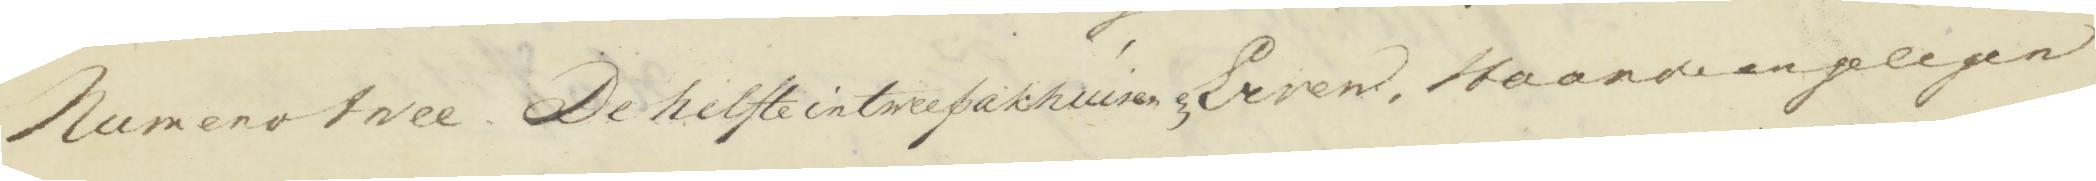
Numero twee De helfte in twee pakhuisen en Erven, staande en gelegen
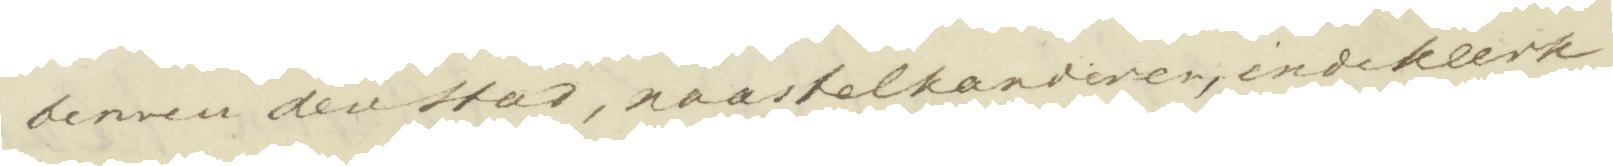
binnen den stad, naast elkanderen, in de klerk
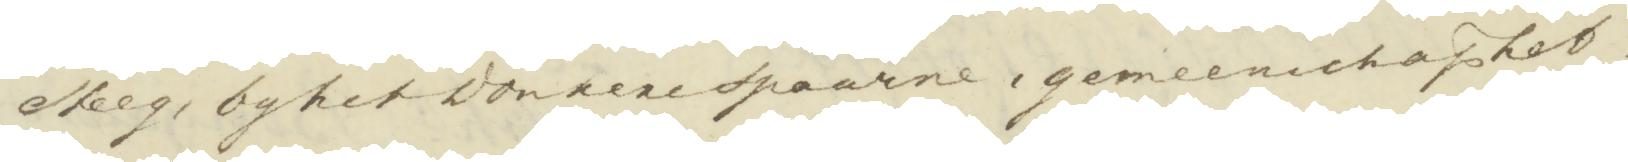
steeg, by het Donkere spaarne, gemeenschap heb
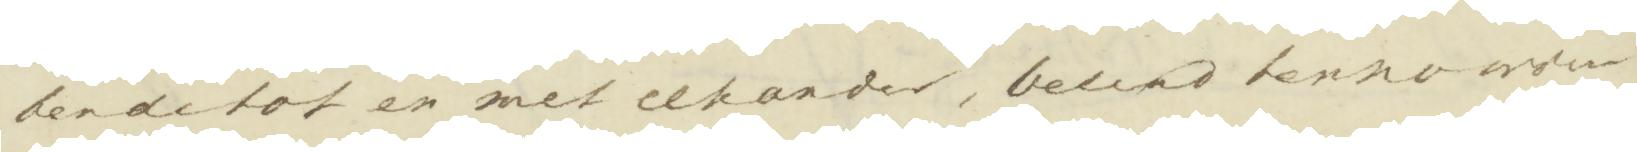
bende tot en met elkander, belend ten noorden
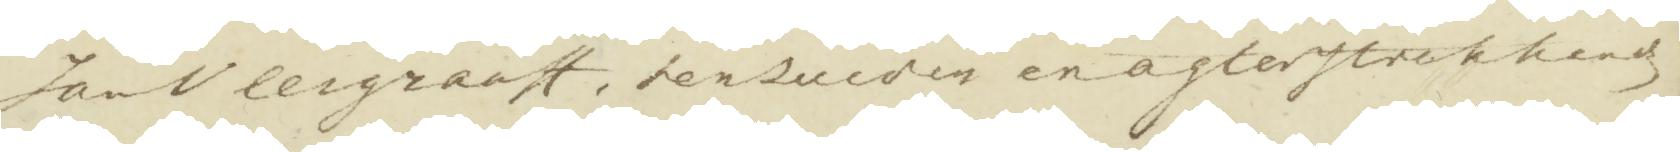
Jan Vleigraaff, ten zuiden en agterstrekkend,
